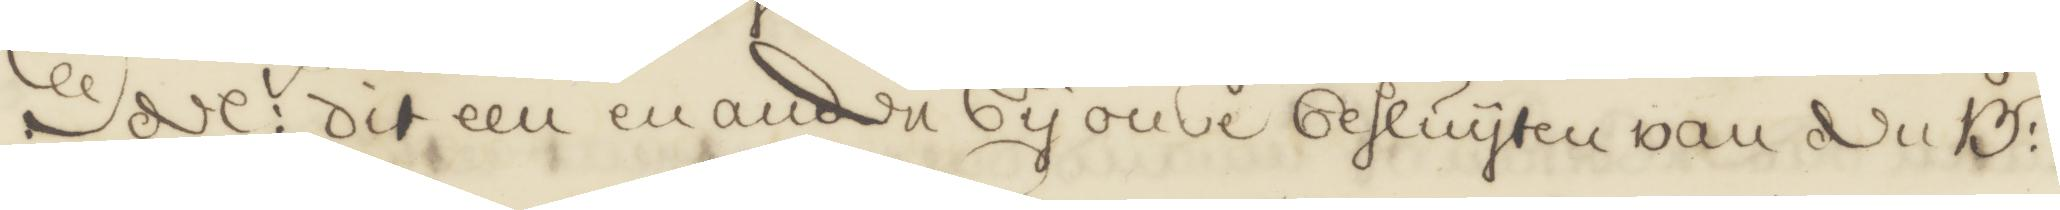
Edel:s dit een en ander bij onse besluijten van den 13:'
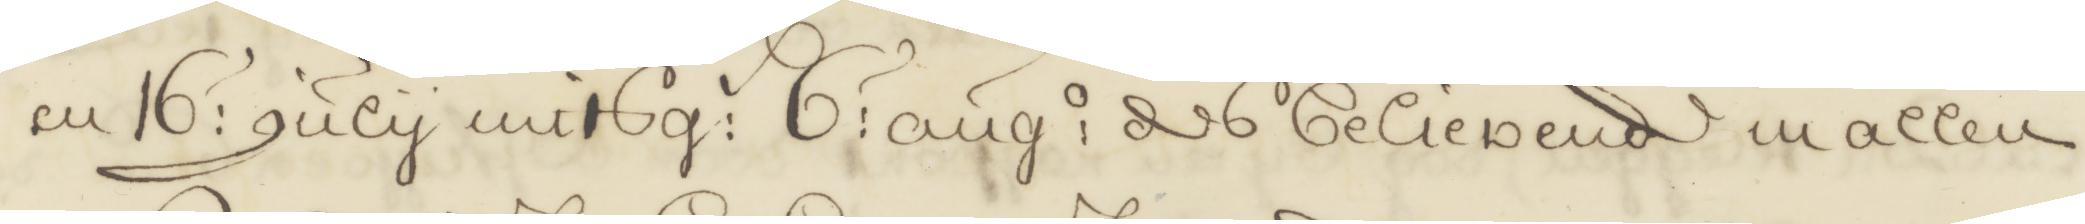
en 16:' julij mitsg:s 6:' aug:o des believende in allen
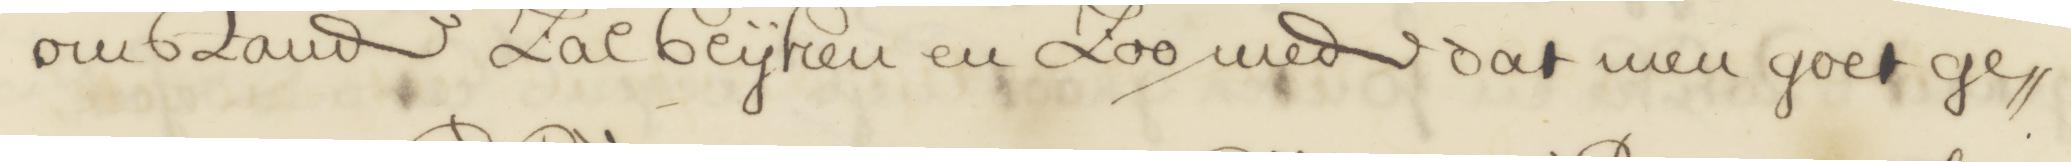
omstande zal blijken en zoo mede dat men goet ge„
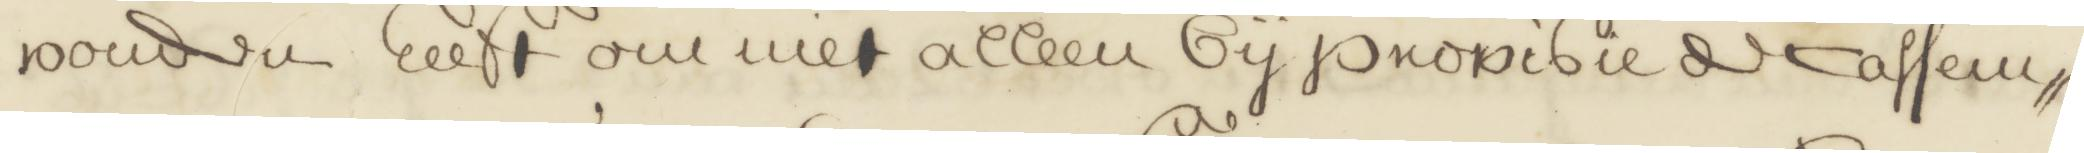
vonden heeft om niet alleen bij provisie de cassem„
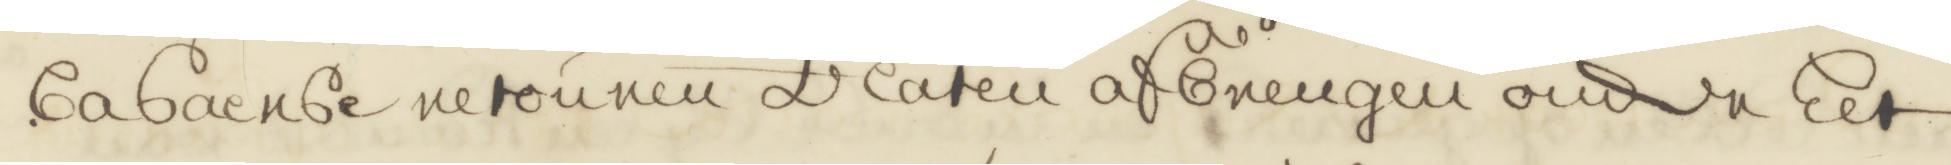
.basaerse retouren te laten afbrengen onder het
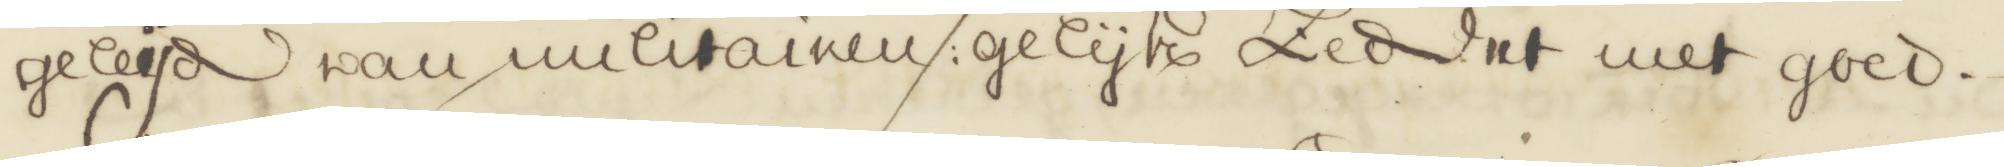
geleijde van militairen /:gelijk zedert met goed.
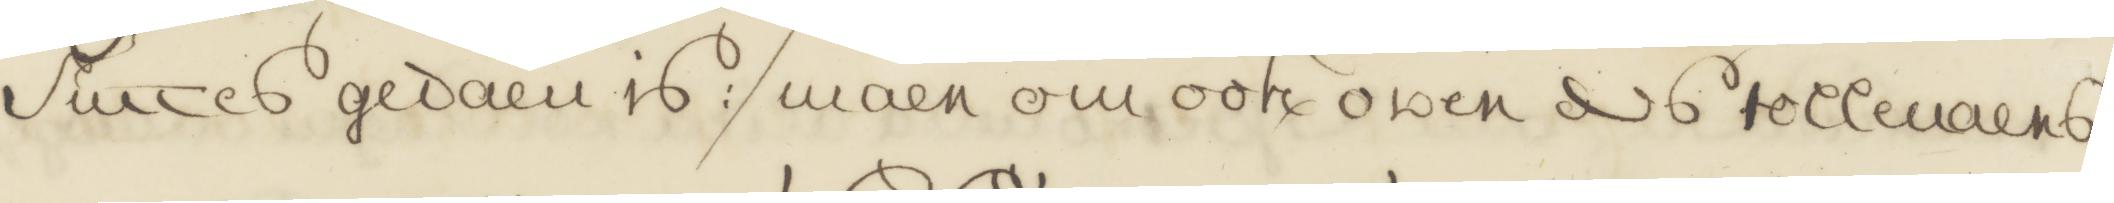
succes gedaen is:/ maer om ook over des tollenaers
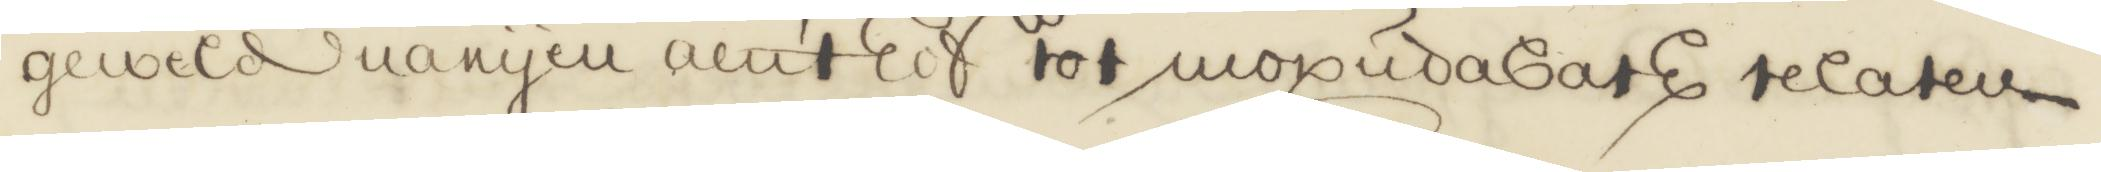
geweldenarijen aen’t hof tot moxudabath telaten
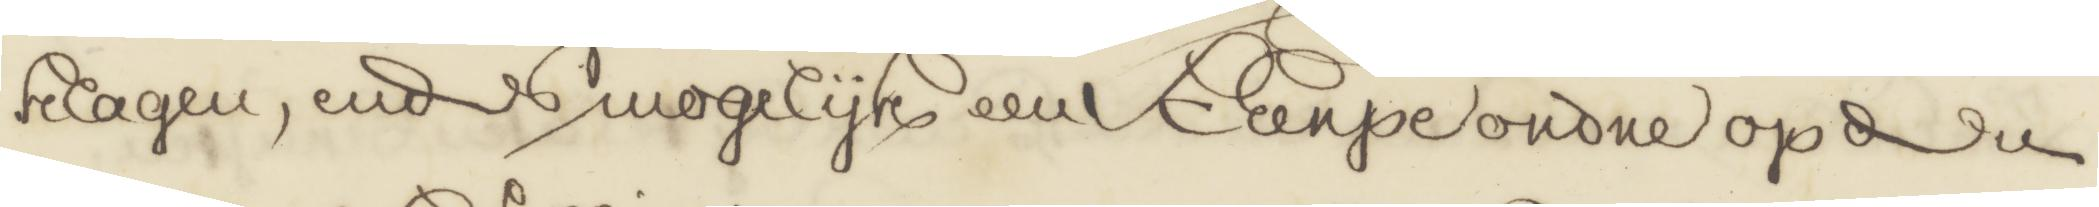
klagen, endes mogelijk een scherpe ordre op den
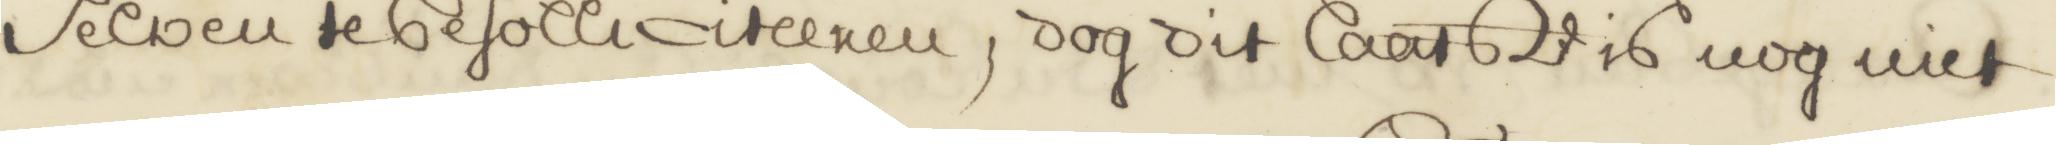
selven te besolliciteeren, dog dit laatste is nog niet
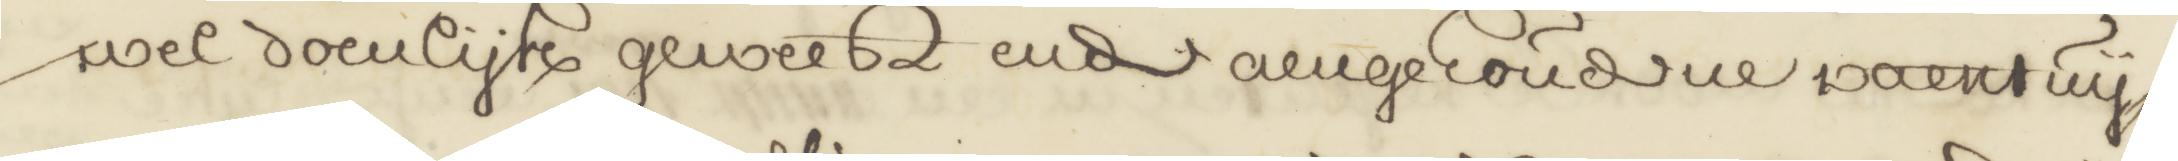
wel doenlijk geweest ende aengehoudene vaertuij„
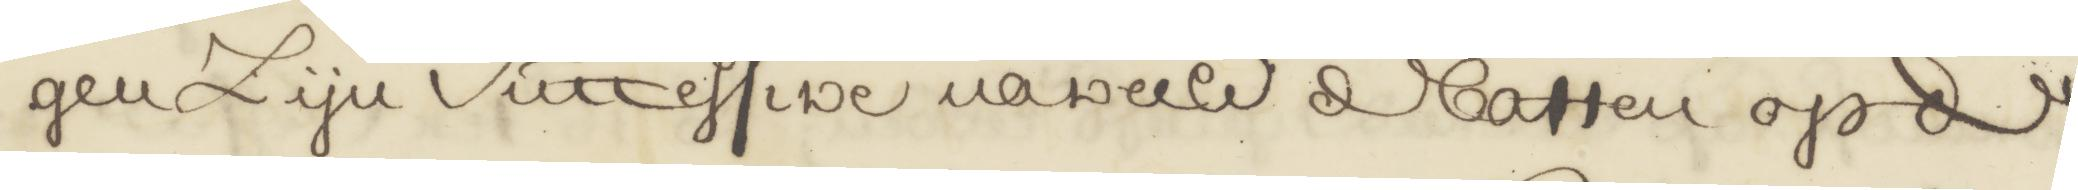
.gen zijn Succcessive naveele debatten op de
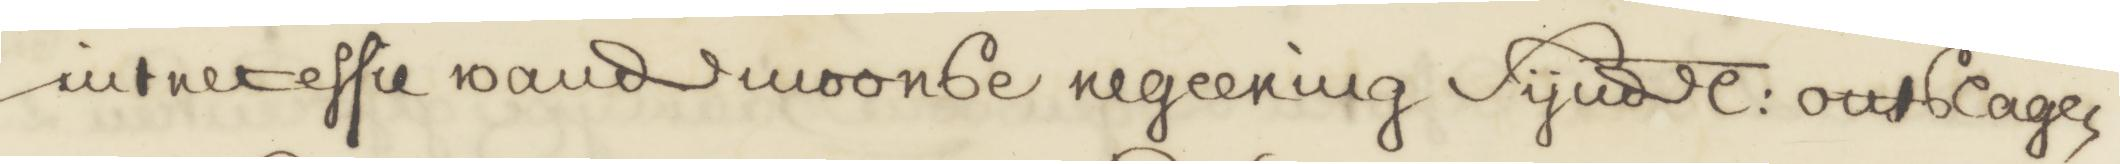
intrecessie vande moorse regeering Eijndelijk ontslagen
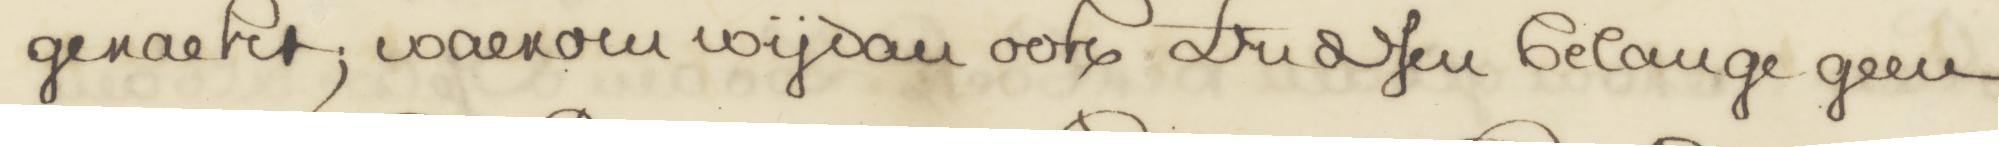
geraekt; waerom wij dan ook ten desen belange geen
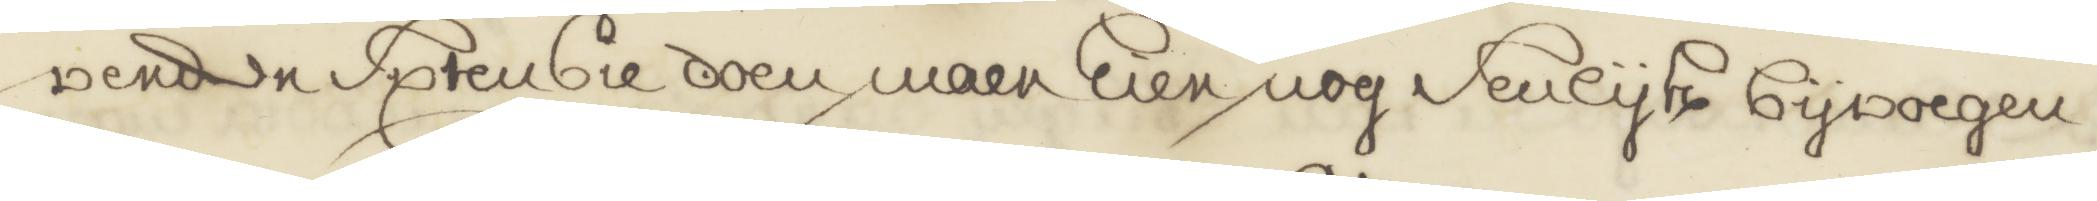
verder Extensie doen maer hier nog Eenlijk bijvoegen
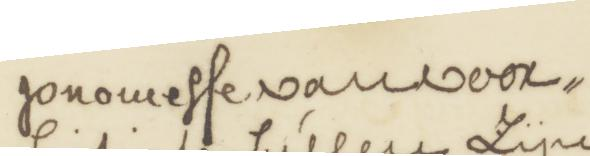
promesse van voor„
